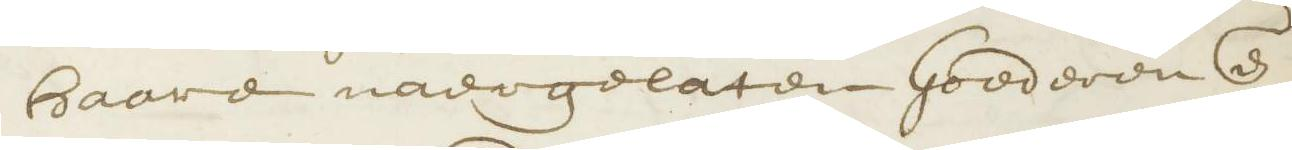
haare naergelaten Goederen ende
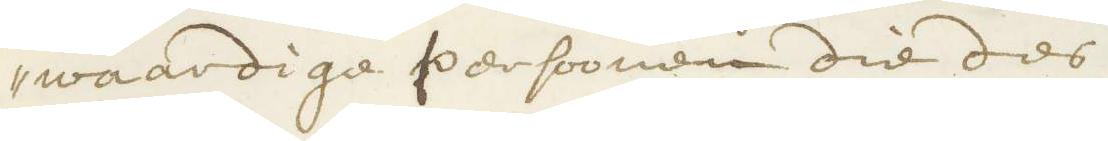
„waardige persoonen die des
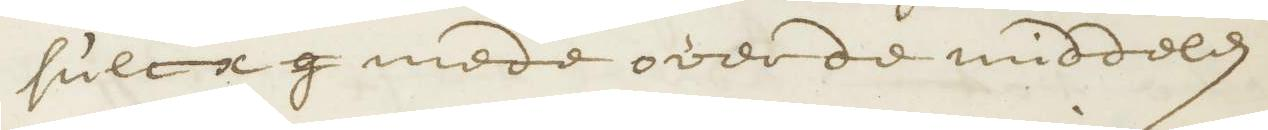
sulcx g mede over de middelen
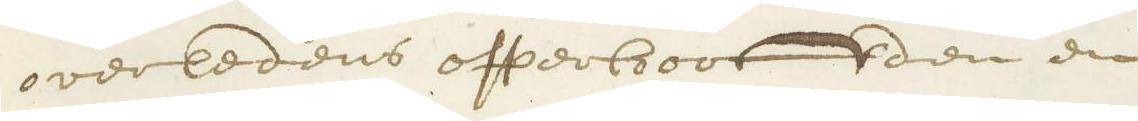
overledens opperhooffden en
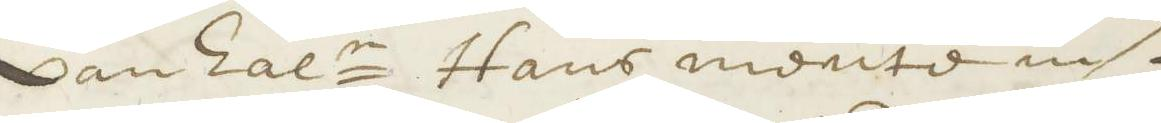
van zal=r Hans mente in
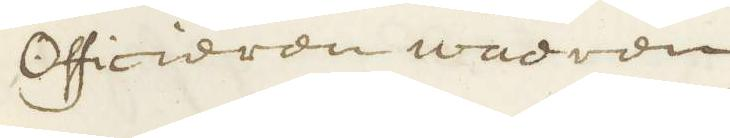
Officieren waeren,
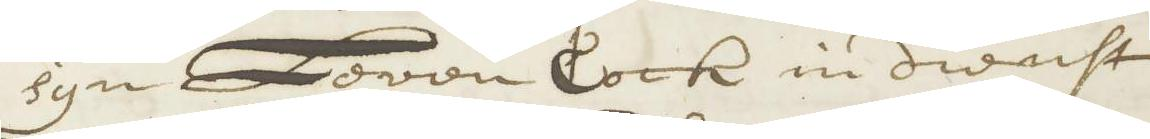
sijn Leven Cock in dienst
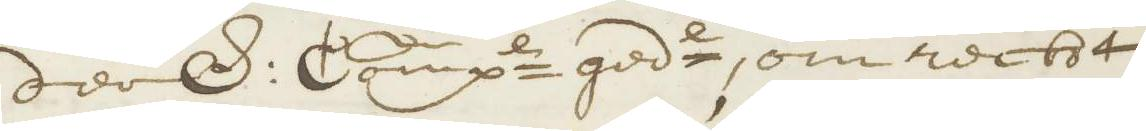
der E: Comp=e ged=e, om recht
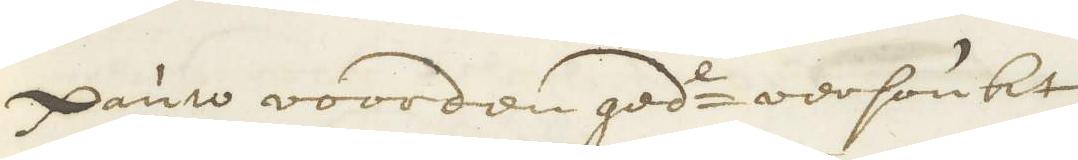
pauw voorden ged=e versoukt
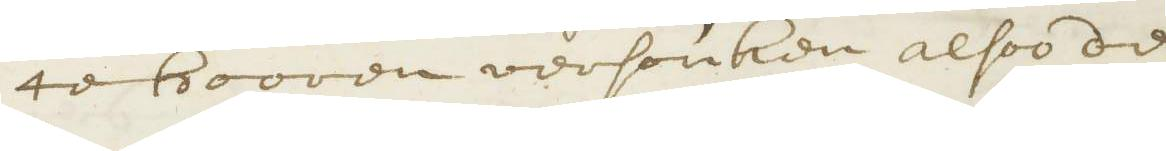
te hooren versouken alsoo de
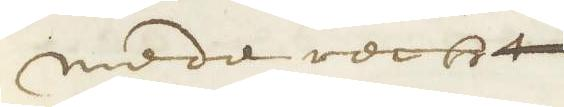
mede recht
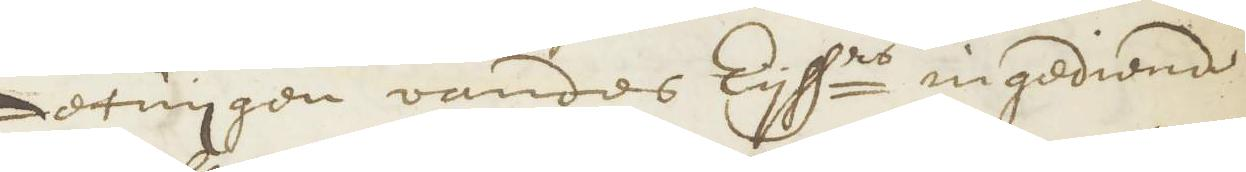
Getuijgen van des Eijss=rs in gediende
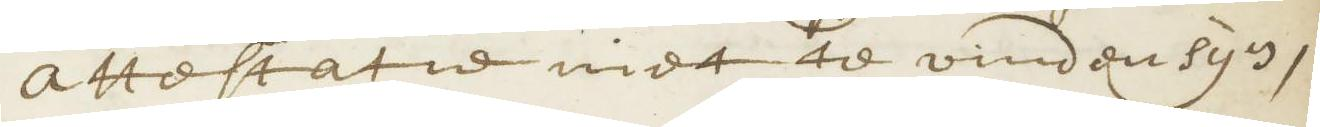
attestatie niet te vinden sijn /
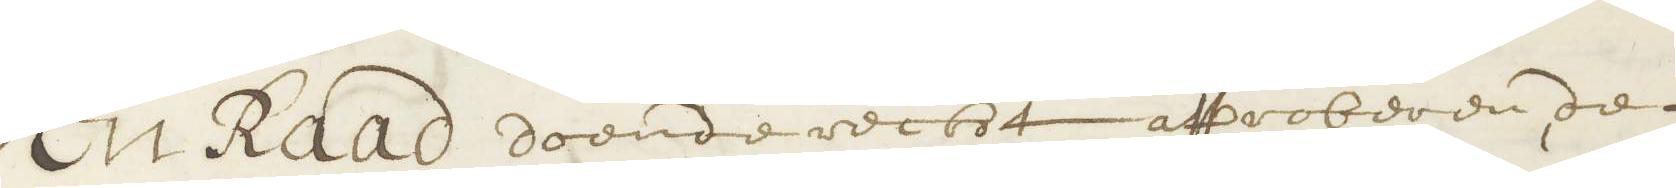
Den Raad doende recht approberen, de
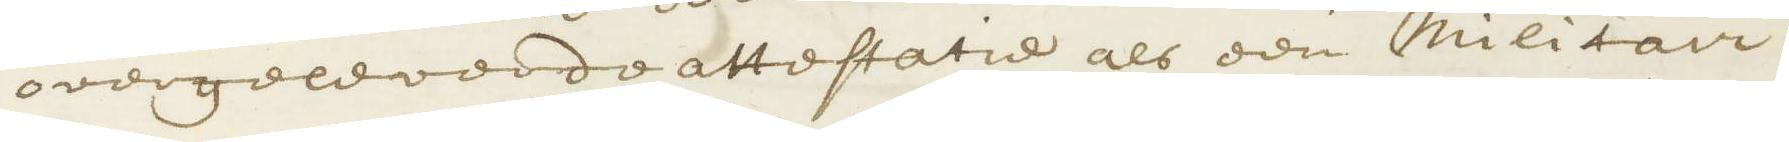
overgeleverde attestatie als een militair
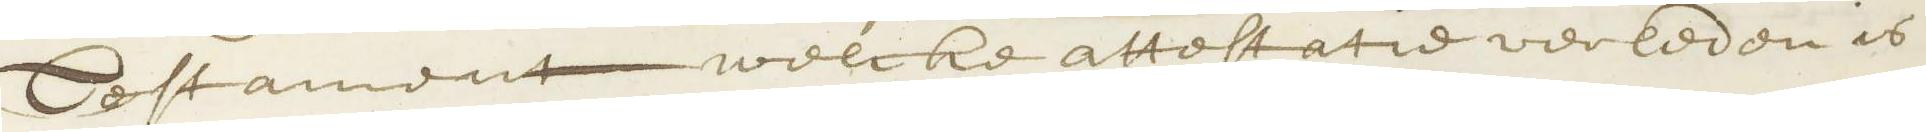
Testament welcke attestatie verleden is
